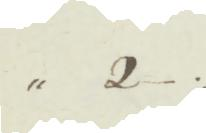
„ 2 —
